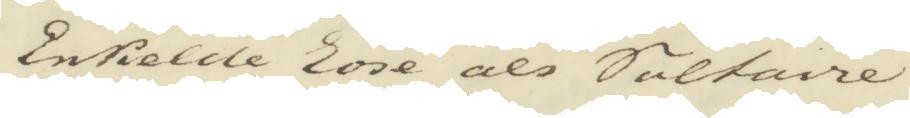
Enkelde rose als Voltaire
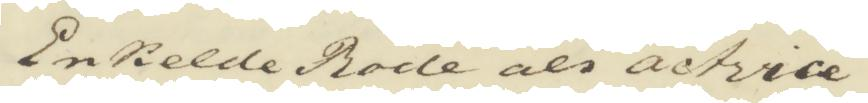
Enkelde Rode als actrice
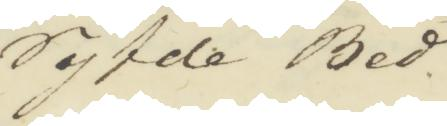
Vyfde Bed.
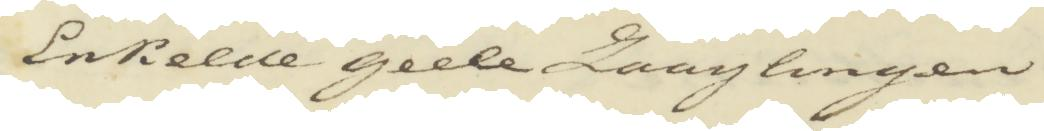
Enkelde geele Zaaylingen
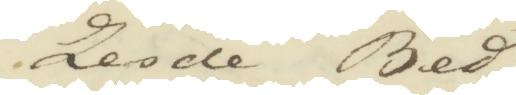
Zesde Bed
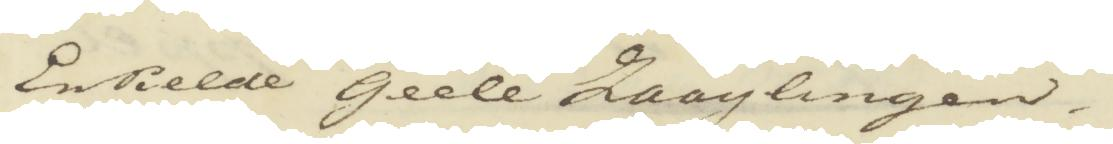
Enkelde Geele Zaaylingen
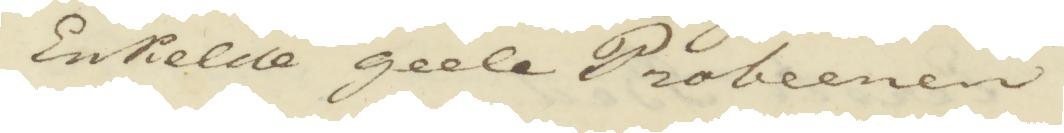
Enkelde geele Probeenen
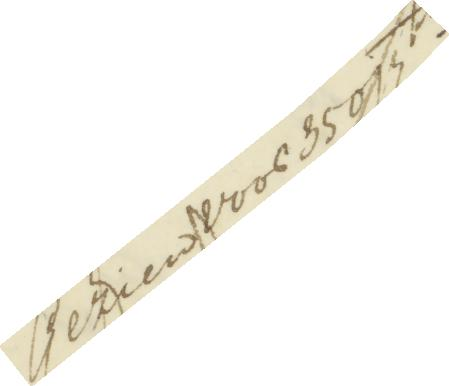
Gezien voor 350 /c=tn
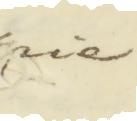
rie
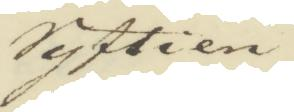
Vyftien
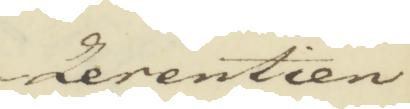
Zeventien
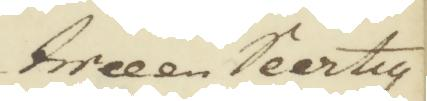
twee en Veertig
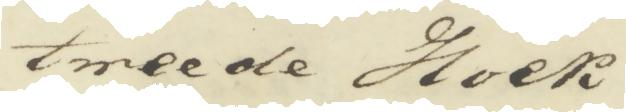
tweede Hoek
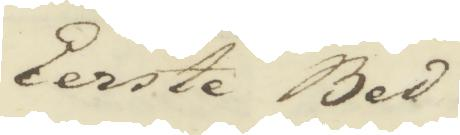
Eerste Bed
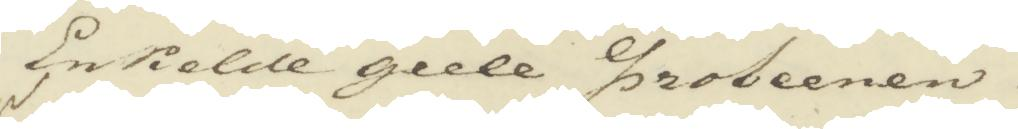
Enkelde geele probeenen
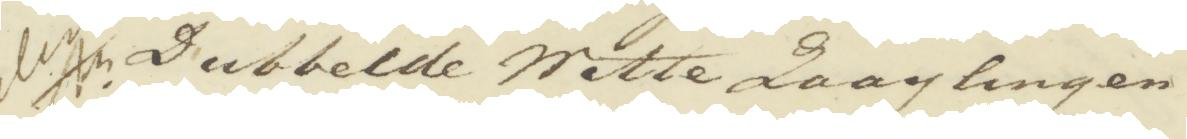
Dubbelde Witte Zaaylingen
